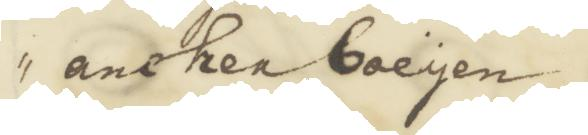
— 2. — „ anckerboeijen - - - - - - - -
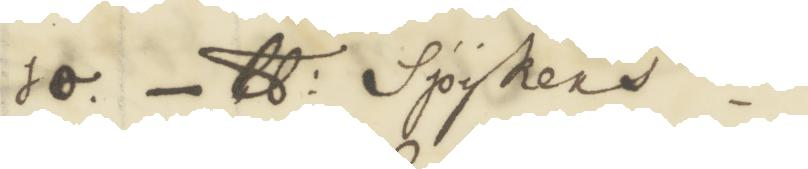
— 10: - lb: spijkers - - - - - - - -
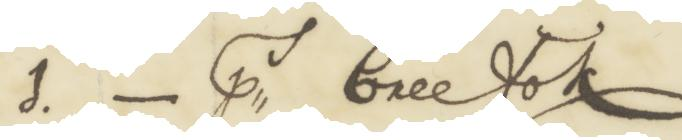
— 1. — p„s breefok - - - - - - - - - -
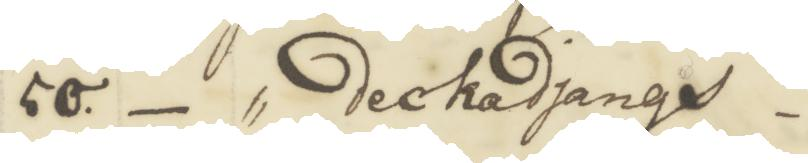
— 50: — „ deckadjangs - - - - - - - -
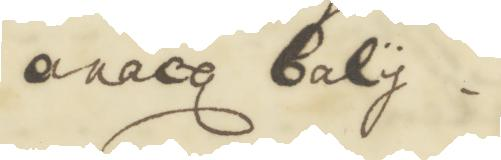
— 1 — „ aracq balij - - - - - - - - -
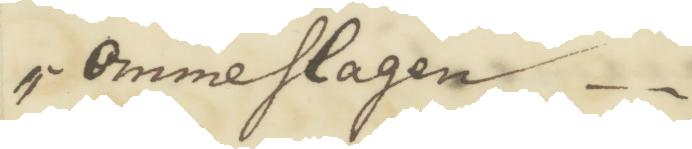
— 2. — „ ommeslagen - - - - - -
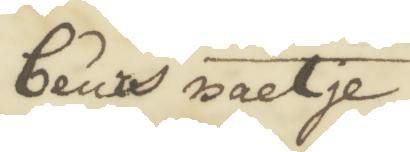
— 1. — „ beurs vaetje - - - - - - -
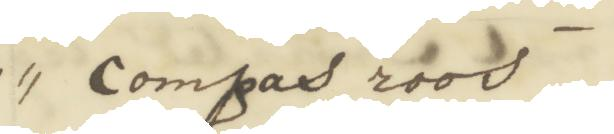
— 1. — „ compas roos - - - - - - -
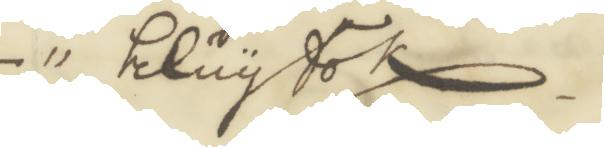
— 1. — „ kluijfok - - - - - - -
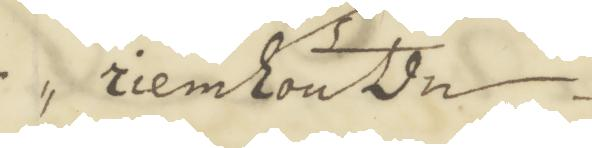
— 6 — „ riemhouten - - - - - - -
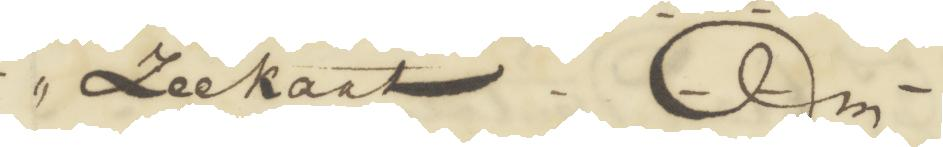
— 1 — „ zeekart - - - - - -
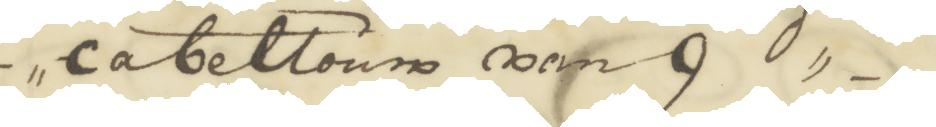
— 1 1/3 — „ cabeltouw van 9 d„m - - - - -
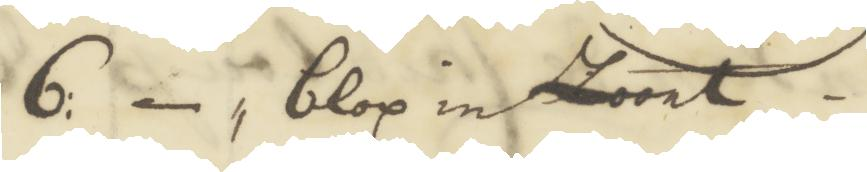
— 6: — „ blox in zoort - - - - - -
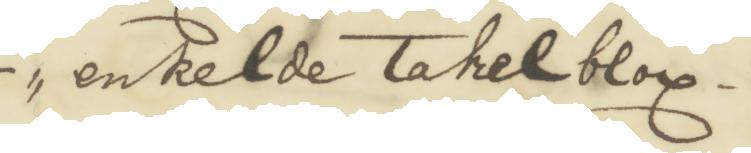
— 2 — „ enkelde takel blox - - - - - - -
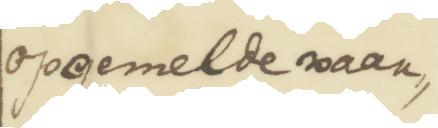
opgemelde vaar„
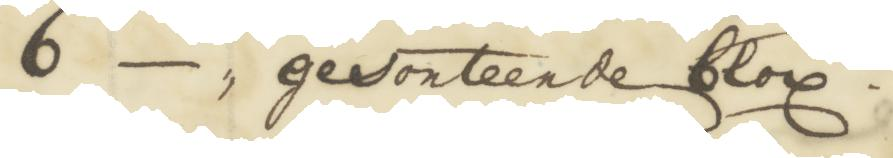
— 6 — „ gesorteerde blox - - - - - -
